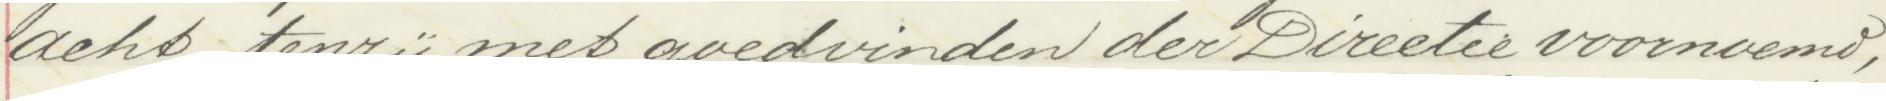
acht tenzij met goedvinden der Directie voornoemd,
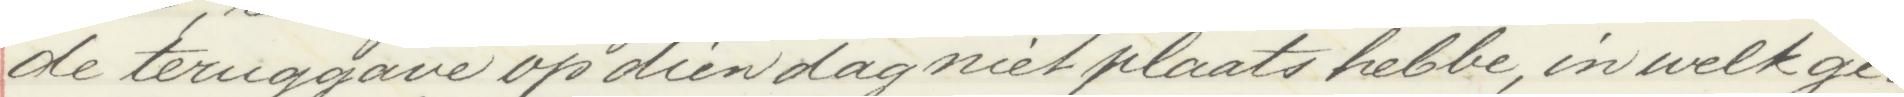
de teruggave op dien dag niet plaats hebbe, in welk ge„
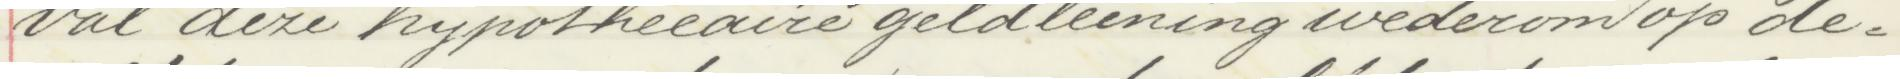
val deze hypothecaire geldleening wederom op de=
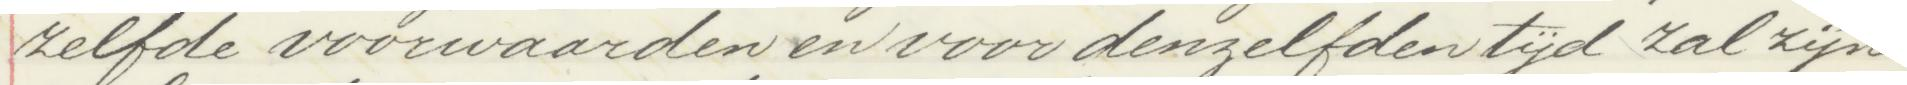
zelfde voorwaarden en voor denzelfden tijd zal zijn
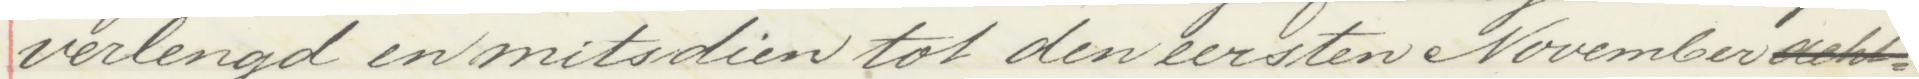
verlengd en mitsdien tot den eersten November acht„
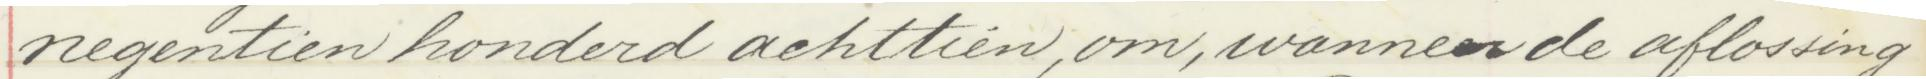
negentien honderd achttien, om, wanneer de aflossing
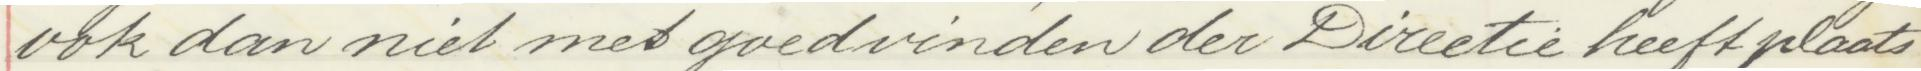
ook dan niet met goedvinden der Directie heeft plaats
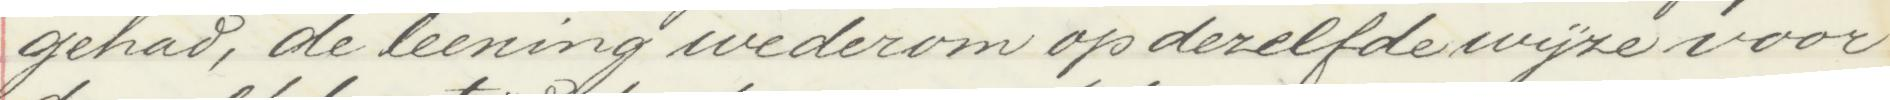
gehad, de leening wederom op dezelfde wijze voor
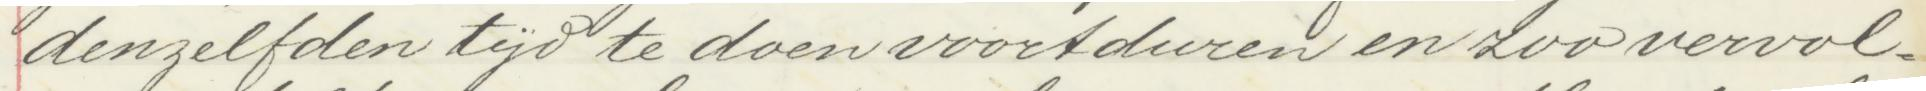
denzelfden tijd te doen voortduren en zoo vervol=
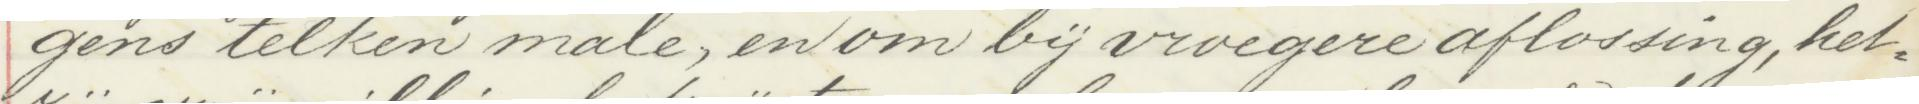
gens telken male, en om bij vroegere aflossing, het„
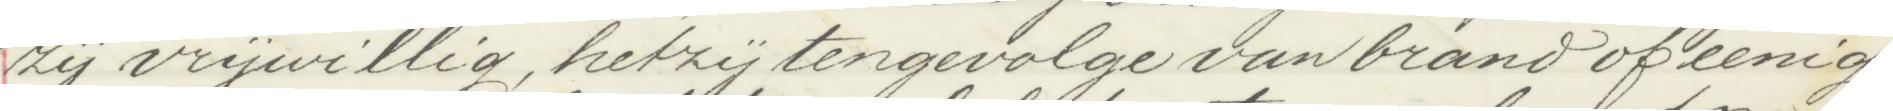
zij vrijwillig, hetzij tengevolge van brand of eenig
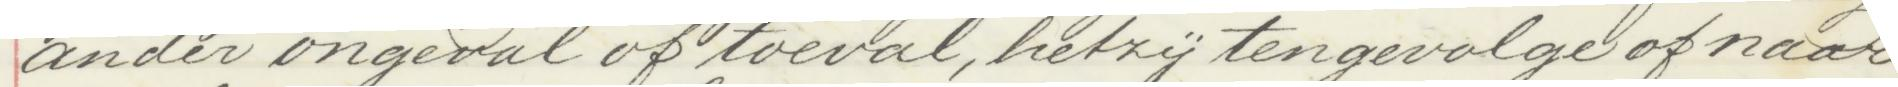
ander ongeval of toeval, hetzij ten gevolge of naar
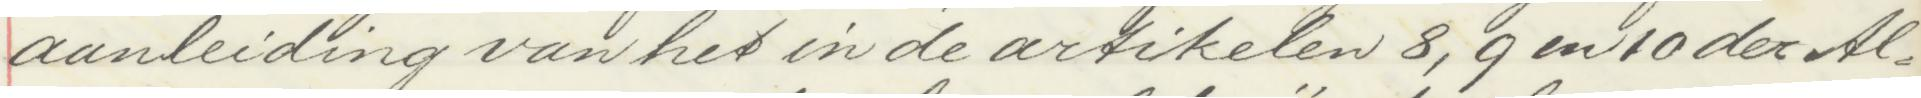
aanleiding van het in de artikelen 8, 9 en 10 der Al„
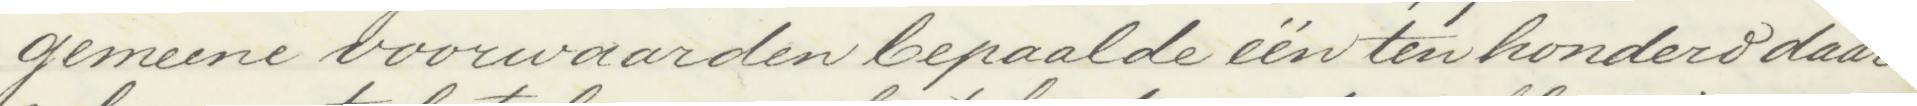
gemeene voorwaarden bepaalde één ten honderd daar
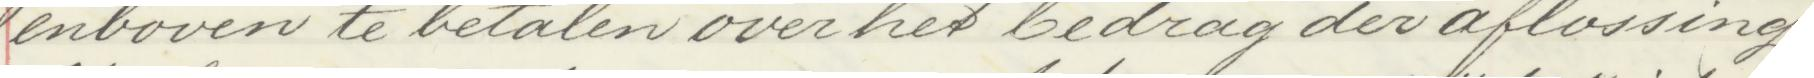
enboven te betalen over het bedrag der aflossing.
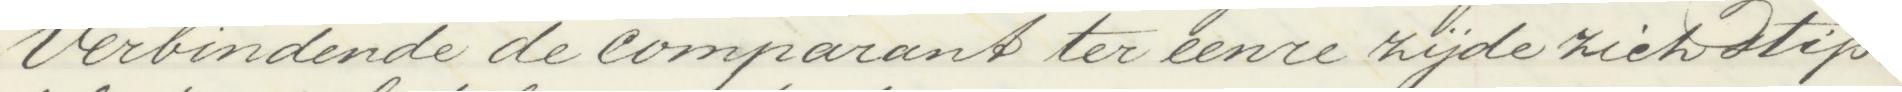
Verbindende de comparant ter eenre zijde zich stip=
